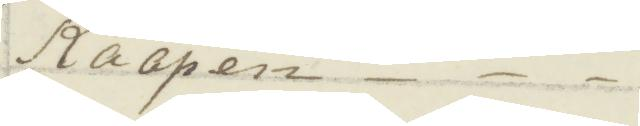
Raapen - - -
